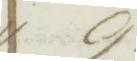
„ 9
